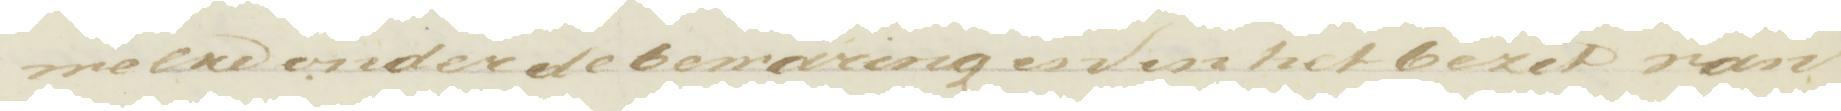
welke onder de bewaring en in het bezit van
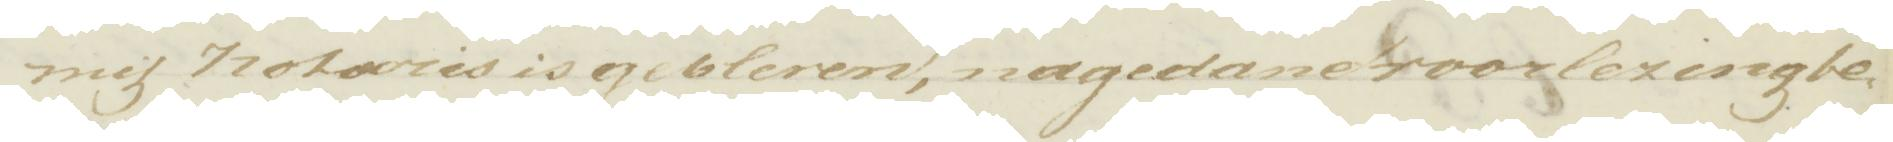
my Notaris is gebleven, na gedane voorlezing be„
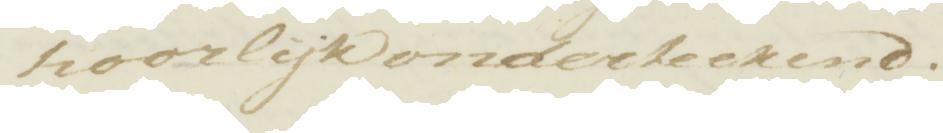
hoorlijk onderteekend.
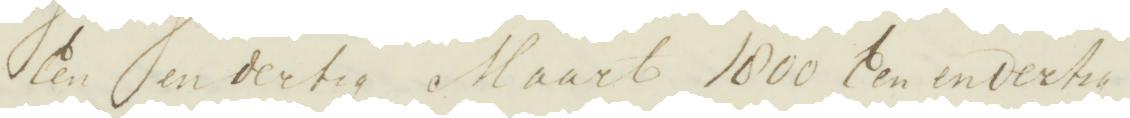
Een en dertig Maart 1800 Een en dertig
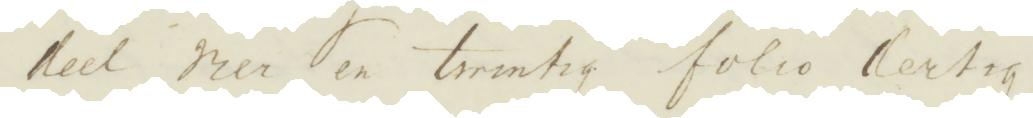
deel vier en twintig folio dertig
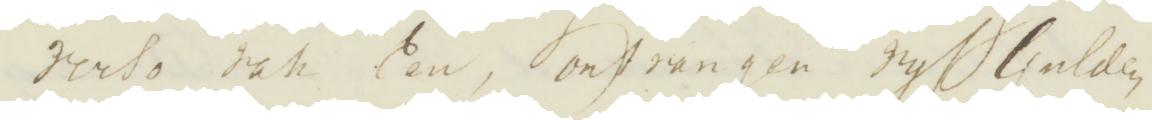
verso vak Een, ontvangen vyf Gulden
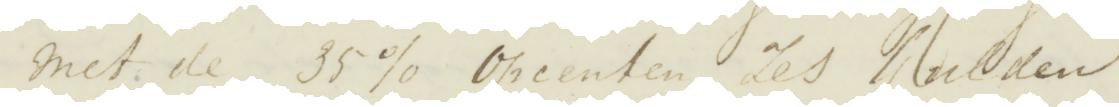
met de 35% opcenten zes Gulden
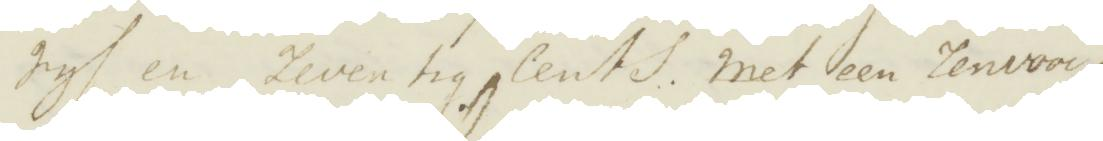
vyf en zeventig Cents. met een renvooi
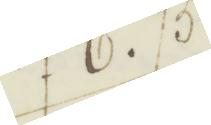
f 6.75
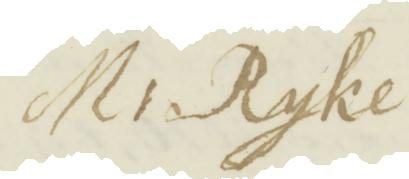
M: Ryke
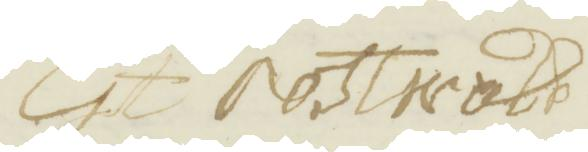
Gt Oostwold
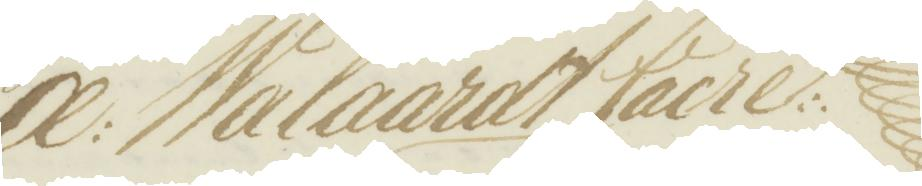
Ae: Walaardt Sacre.
